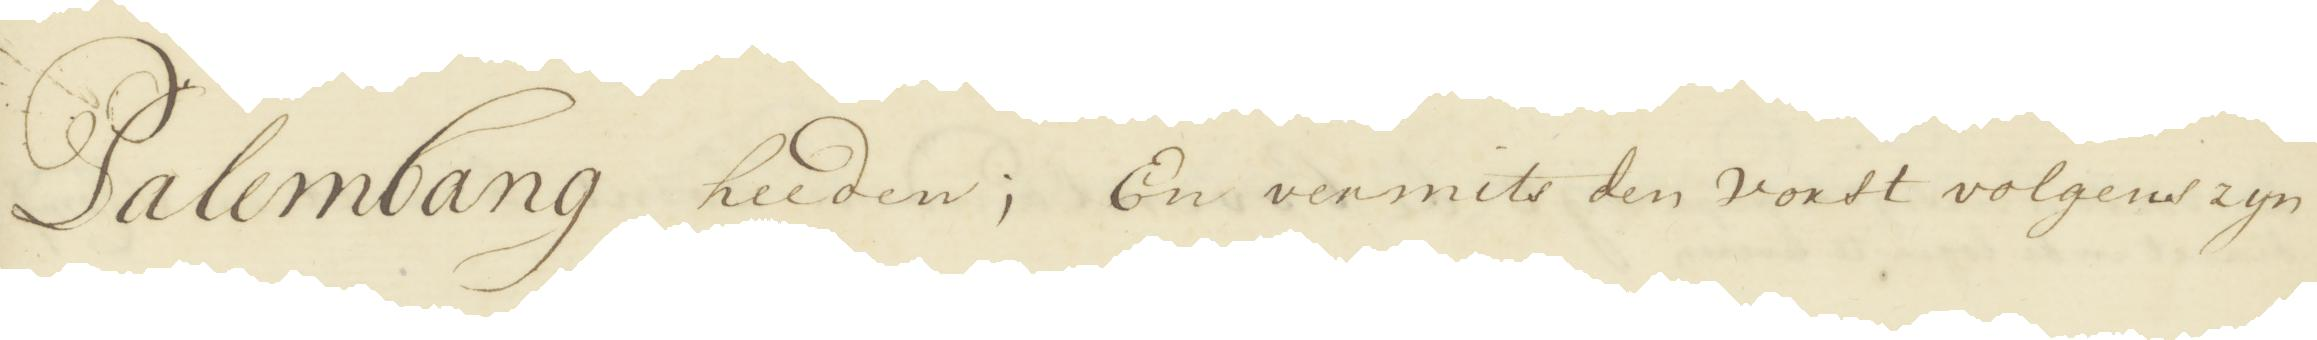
Palembang heeden; En vermits den vorst volgens zyn
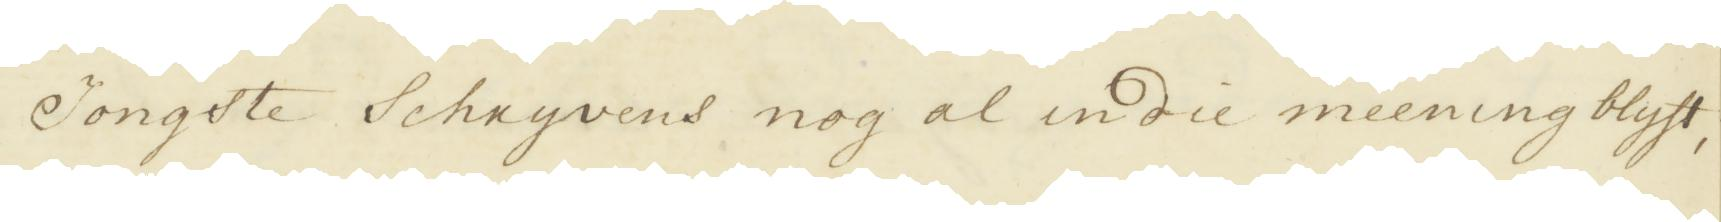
Iongste schryvens nog al in die meening blijft,
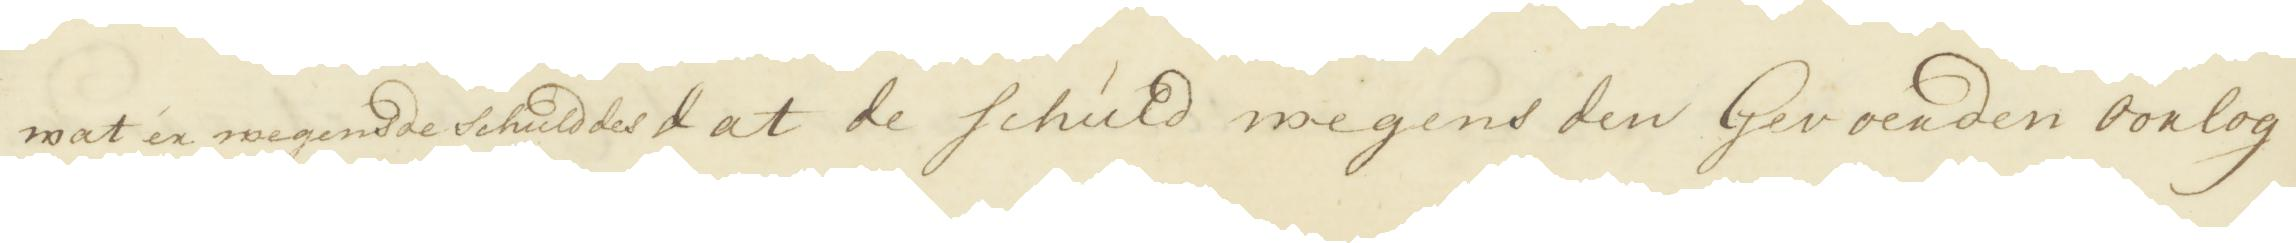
wat er wegens de schuld des dat de schuld wegens den Gevoerden oorlog
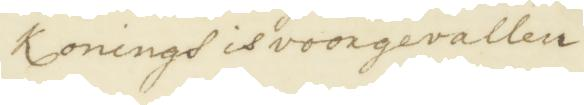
Konings is voorgevallen
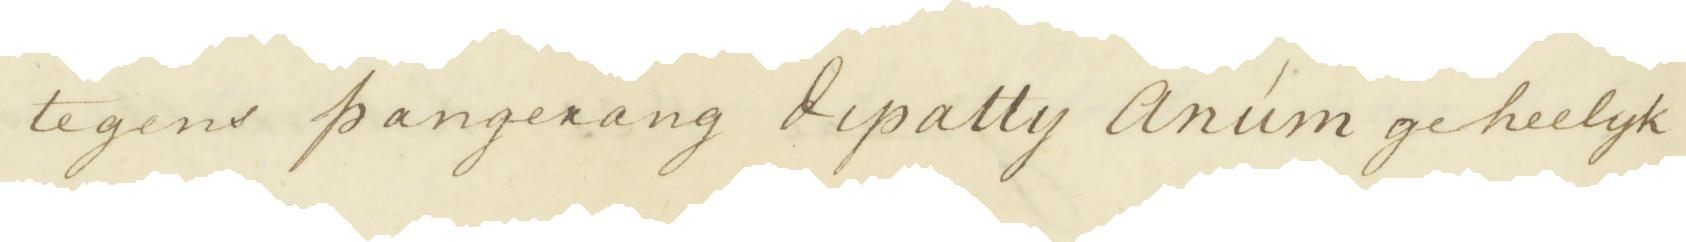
tegens pangerang dipatty Anum geheelyk
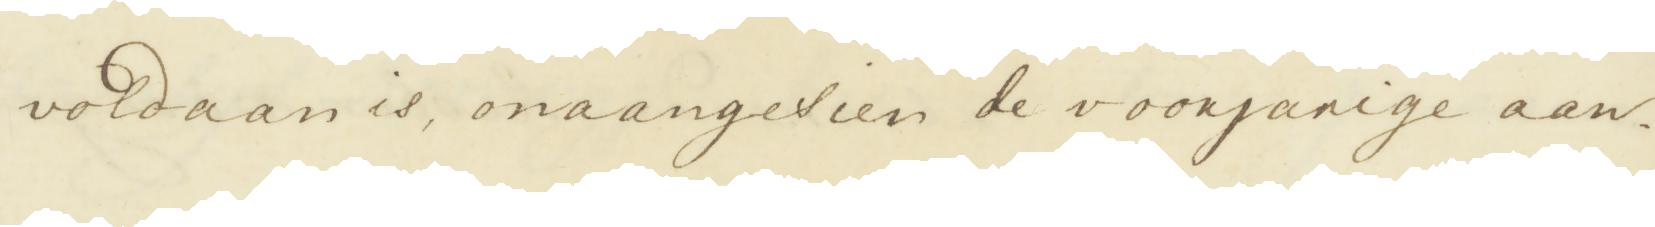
voldaan is, onaangesien de voorjarige aan.
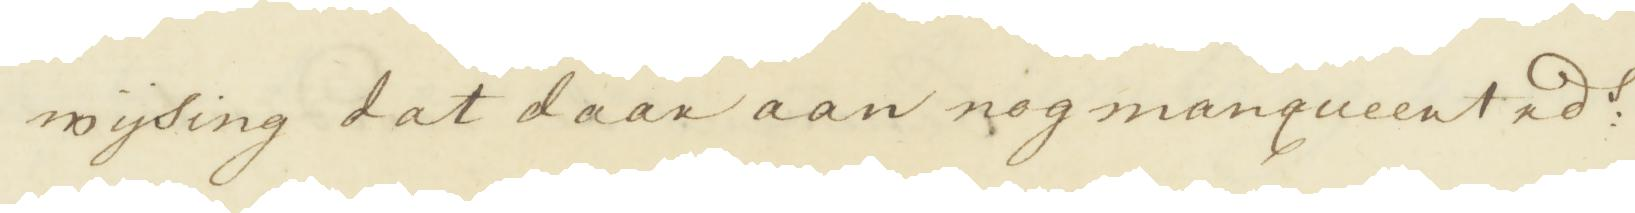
wijsing dat daar aan nog manqueert rd:s
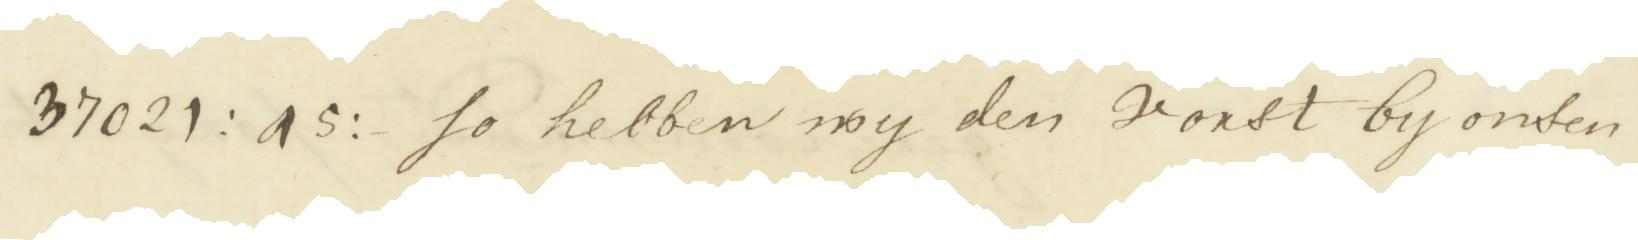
37021: 45:- so hebben wy den vorst by onsen
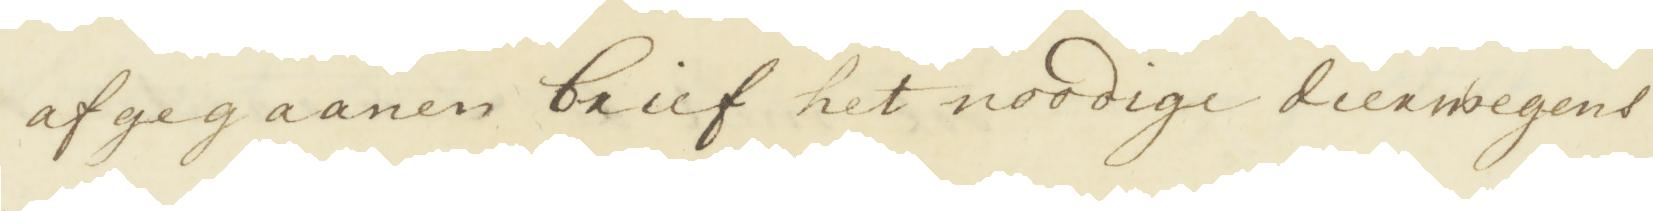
afgegaanen brief het noodige dierwegens
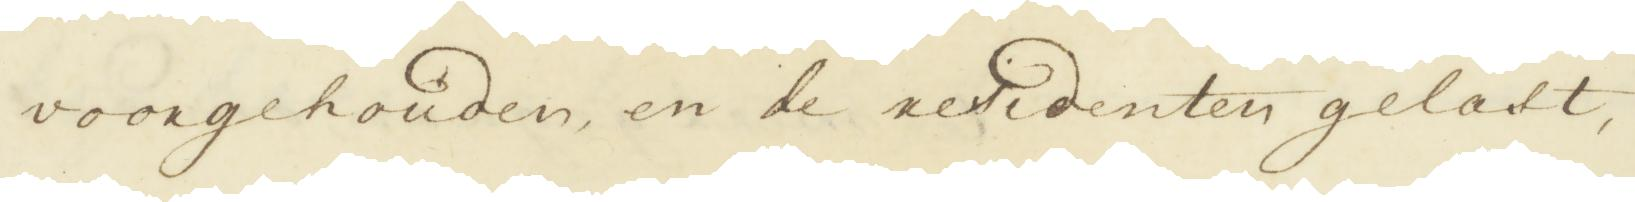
voorgehouden, en de residenten gelast,
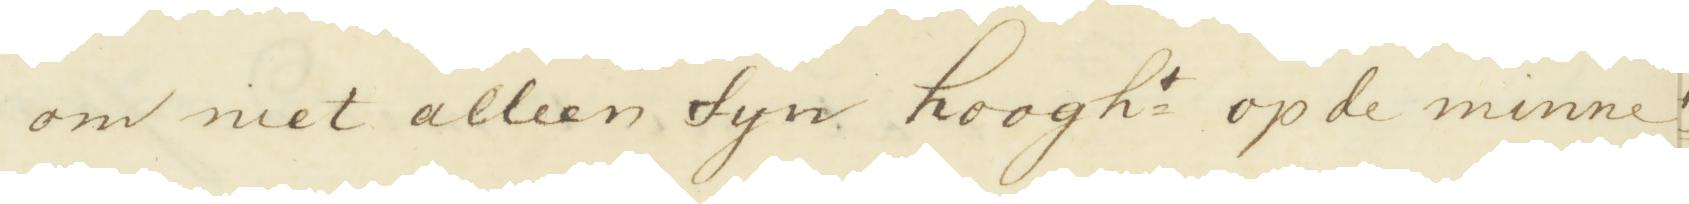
om niet alleen syn hoogh=t op de minne
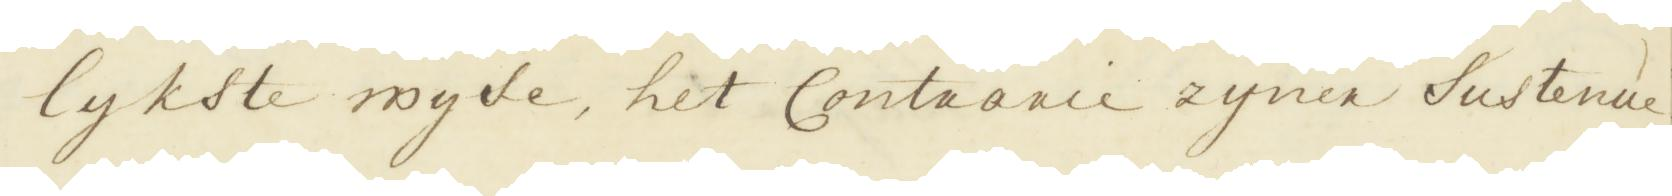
lykste wyse, het Contrarie zyner sustenue
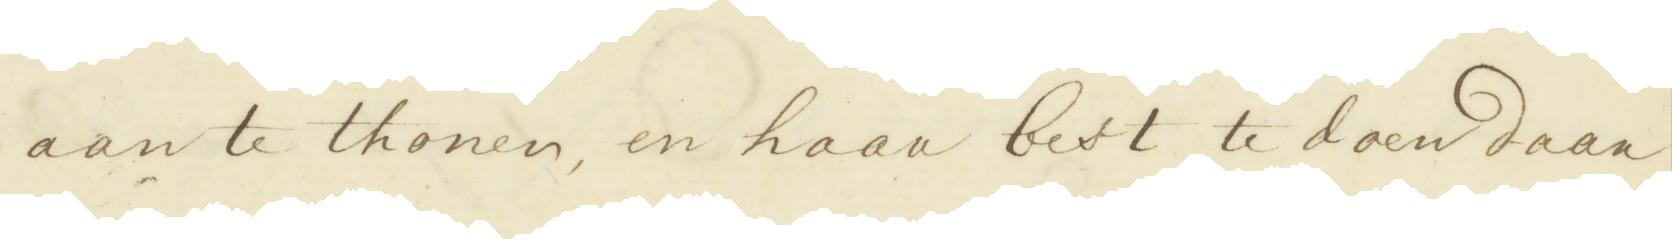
aan te thonen, en haar best te doen daar
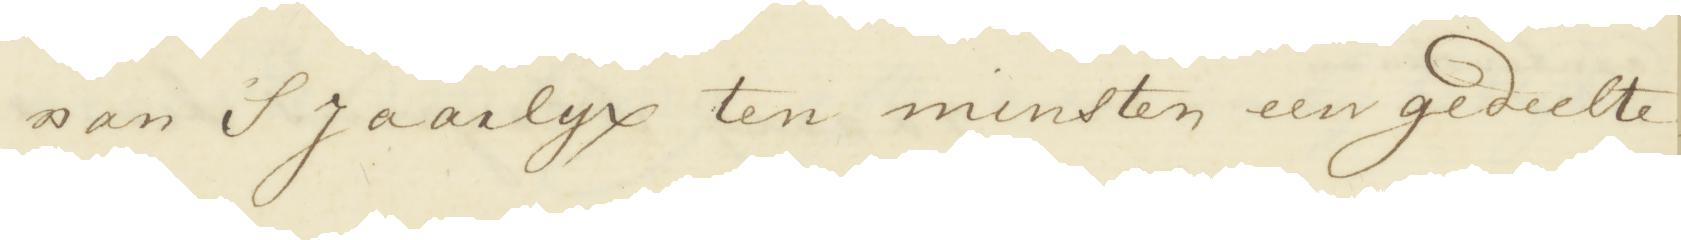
van 's jaarlyx ten minsten een gedeelte
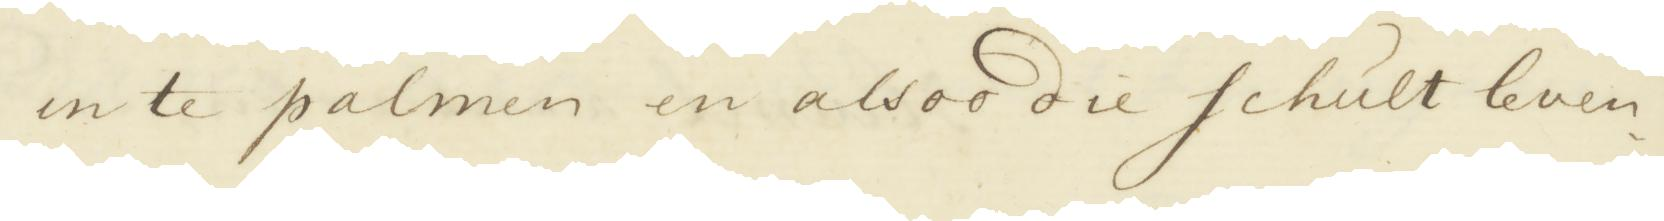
in te palmen en alsoo die schult leven-
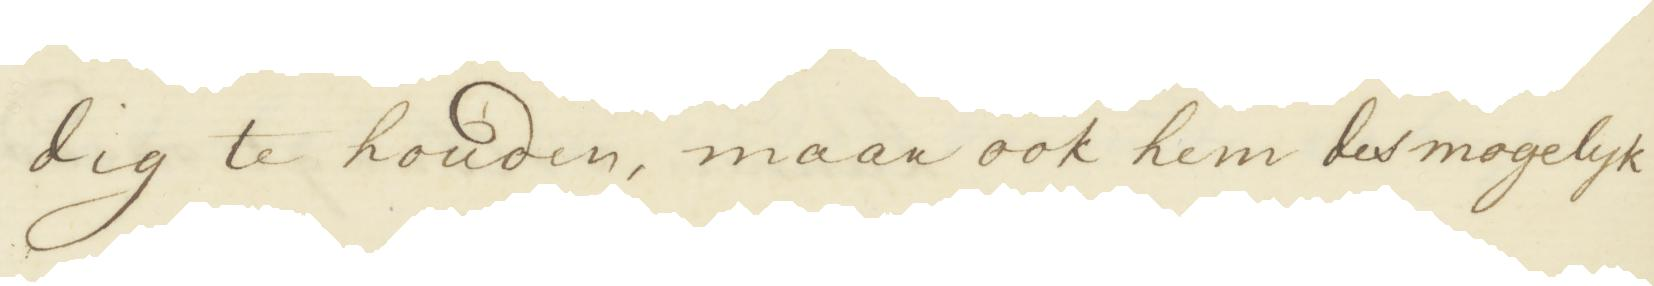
dig te houden, maar ook hem des mogelijk
